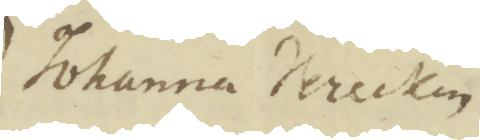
Johanna Vereeken
